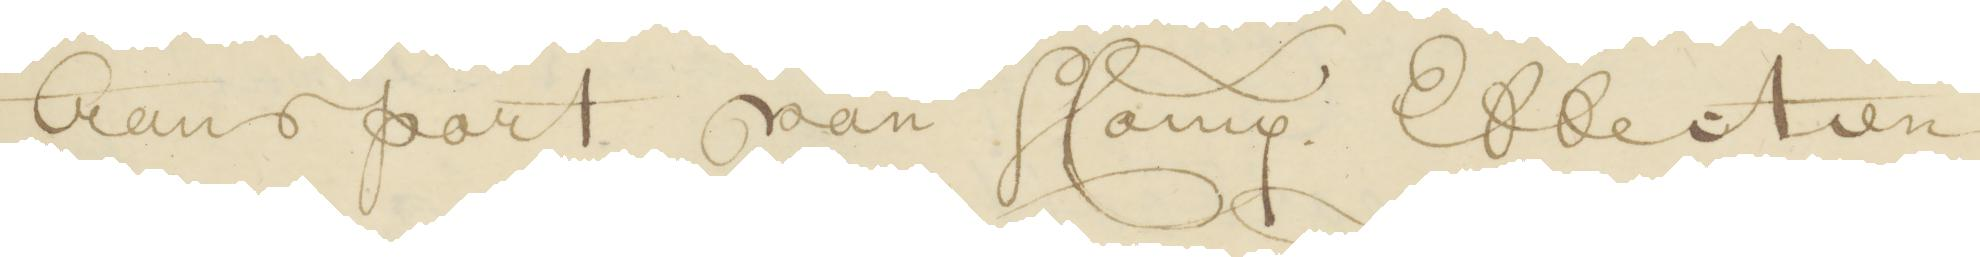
transport van 'S Comp: Effecten
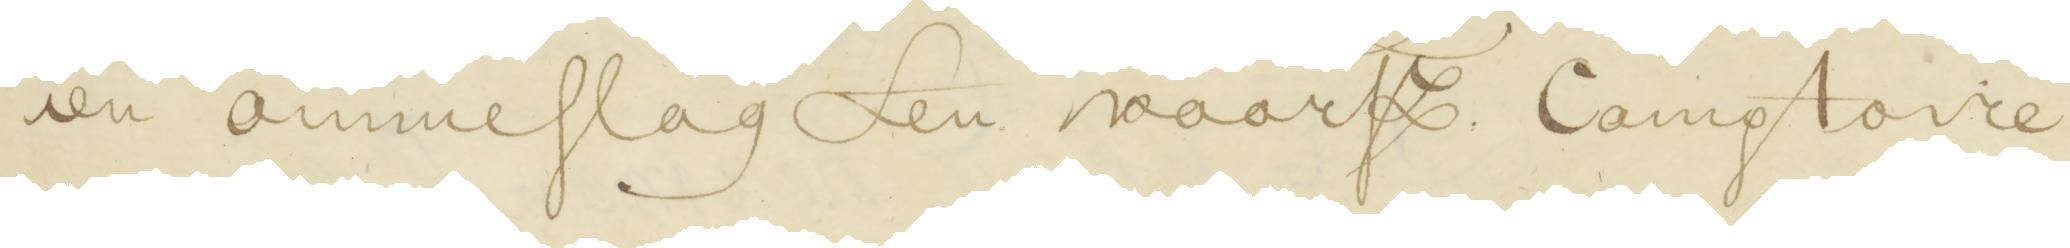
en ommeslag Ten voorsz: Comptoire
